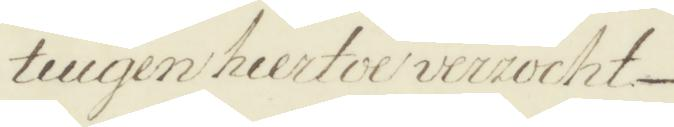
tuigen hiertoe verzocht.
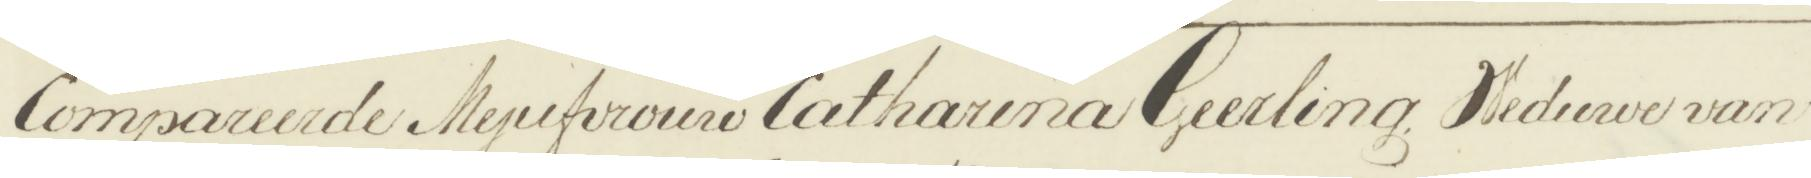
Compareerde Mejufvrouw Catharina Geerling, Weduwe van
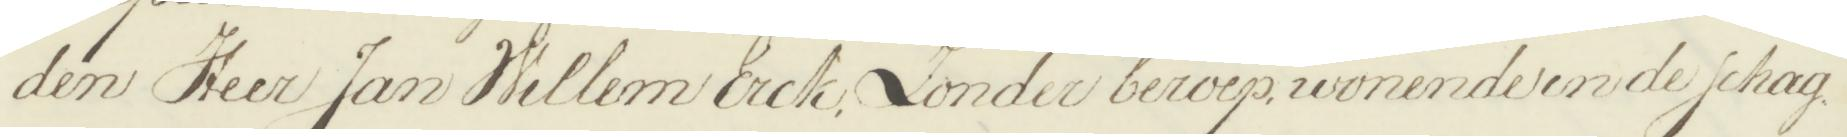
den Heer Jan Willem Erck, Zonder beroep, wonende in de schag„
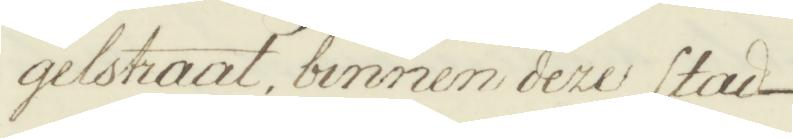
gelstraat, binnen deze stad-
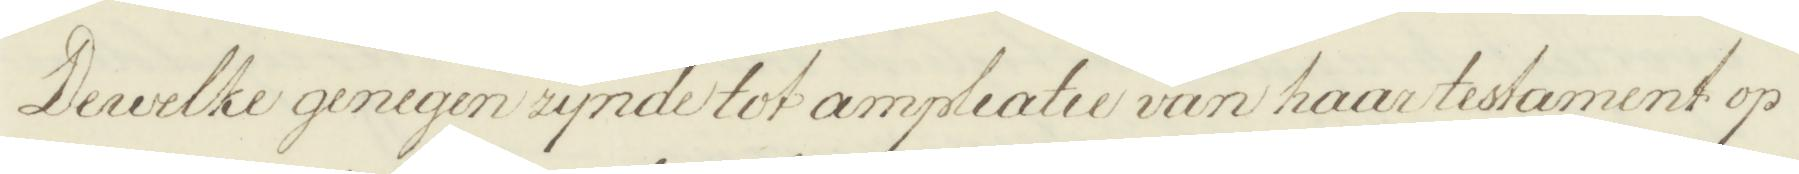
Dewelke genegen zynde tot ampliatie van haar testament op
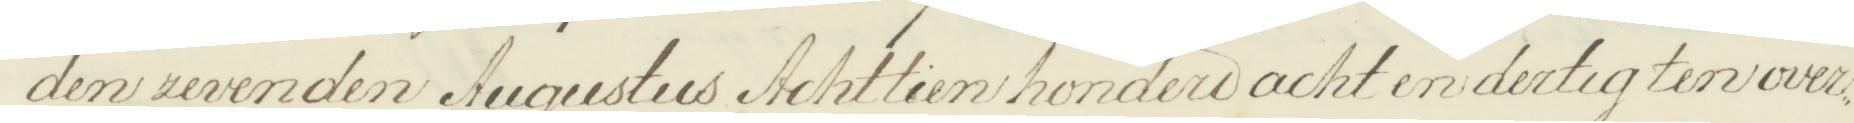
den zevenden Augustus Achttien honderd acht en dertig ten over
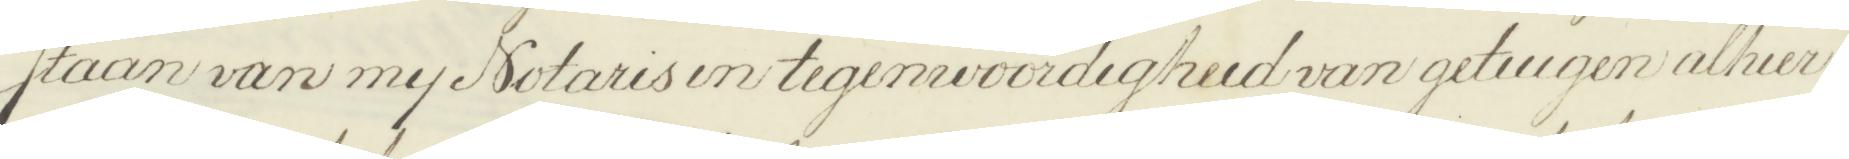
staan van my Notaris in tegenwoordigheid van getuigen alhier
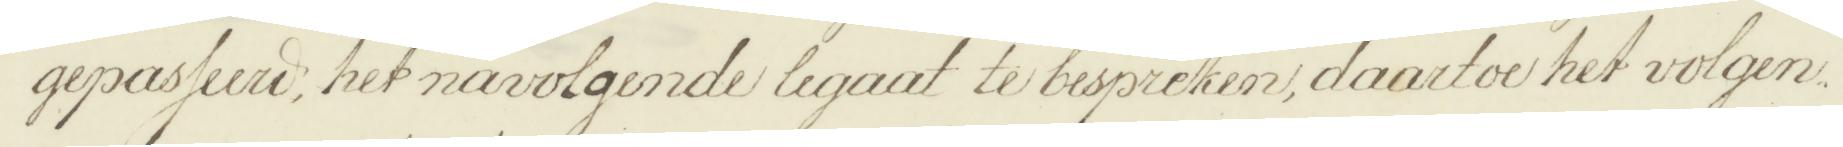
gepasseerd, het navolgende legaat te bespreken, daartoe het volgen„
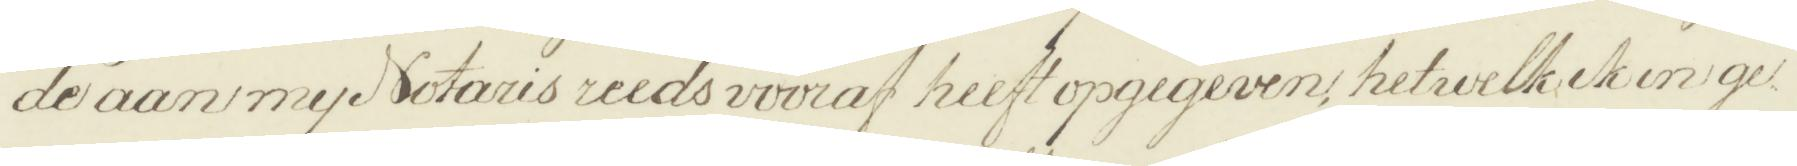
de aan my Notaris reeds vooraf heeft opgegeven, hetwelk ik in ge„
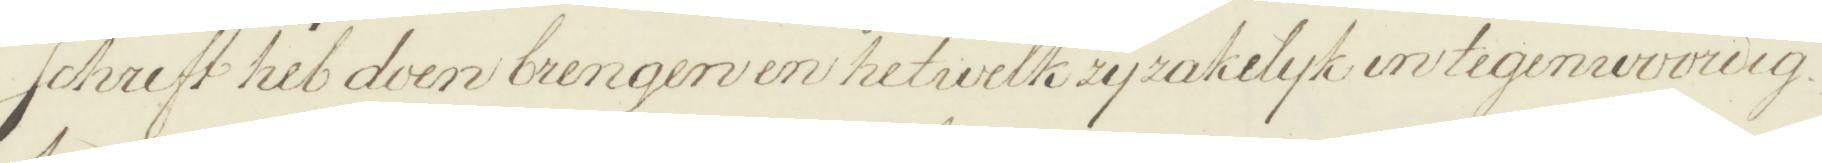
schrift heb doen brengen en hetwelk zy zakelyk in tegenwoordig„
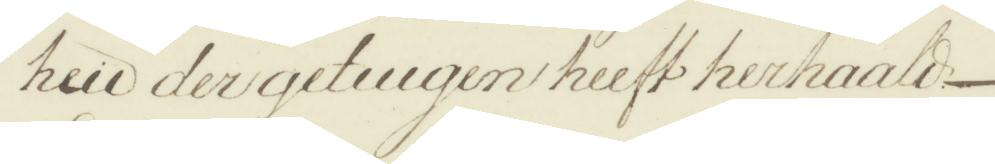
heid der getuigen heeft herhaald
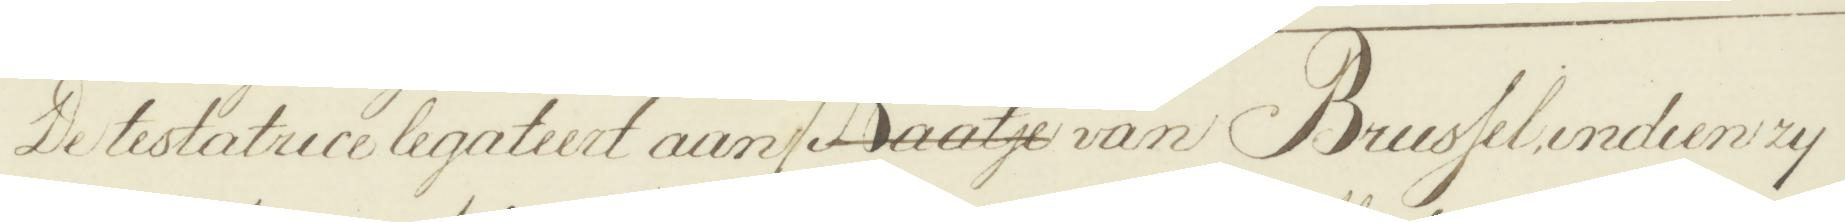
De testertrice legateert aan ¶ Naatje van Brussel, indien zy
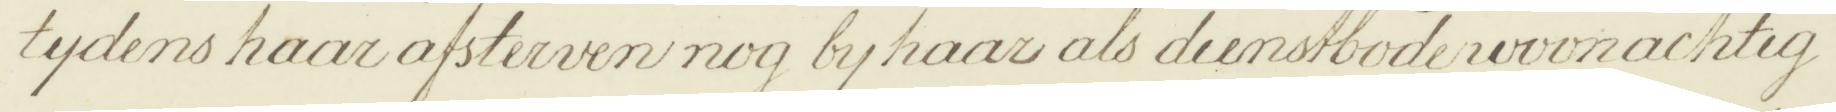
tydens haar afsterven nog by haar als dienstbode woonachtig
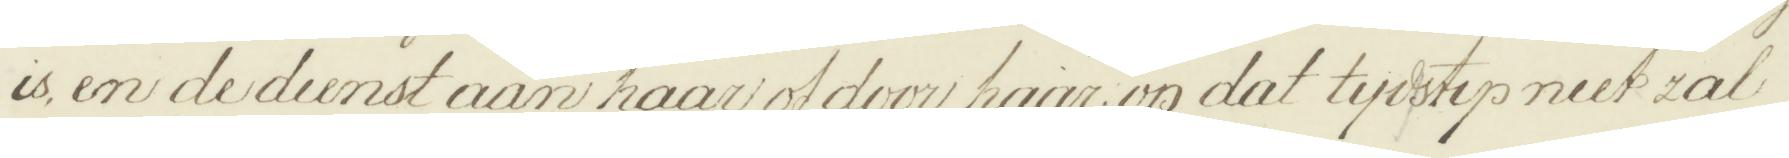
is, en de dienst aan haar of door haar op dat tijdstip niet zal,
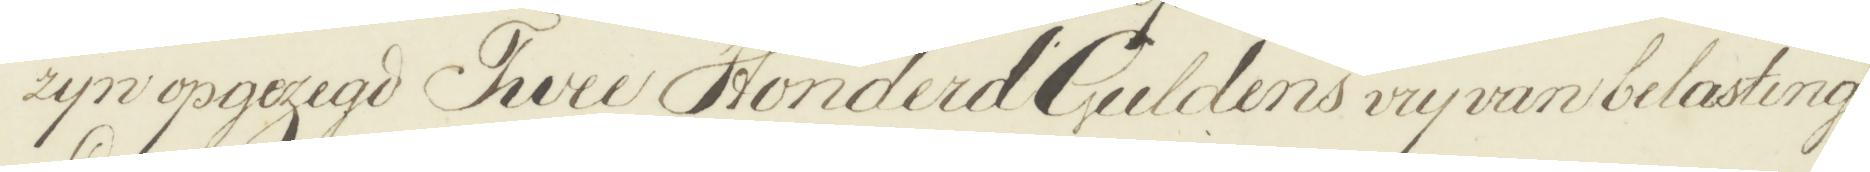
zyn opgezegd Twee Honderd Guldens vry van belasting.
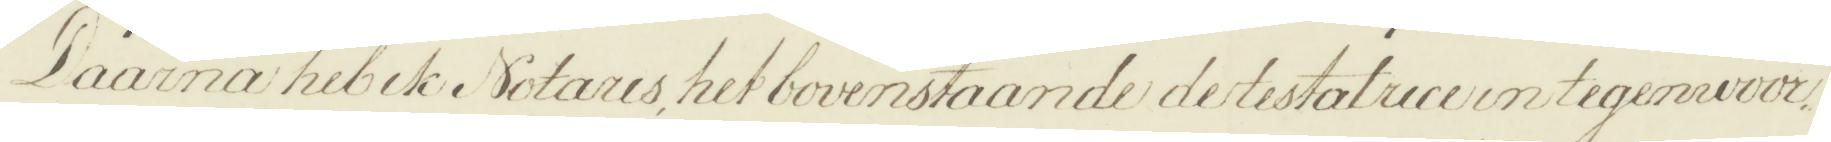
Daarna heb ik Notaris, het bovenstaande de testatrice in tegenwoor„
